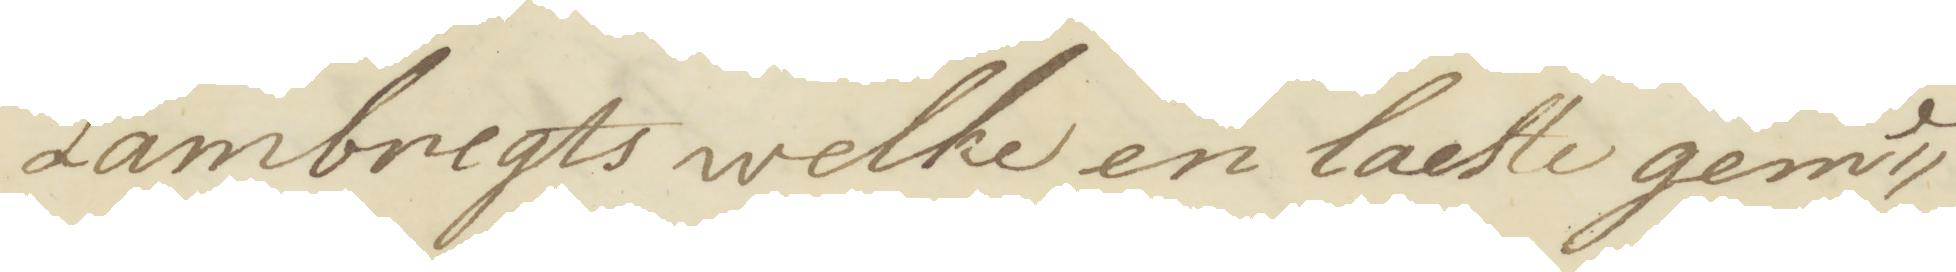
lambregts welke en laeste gem„e
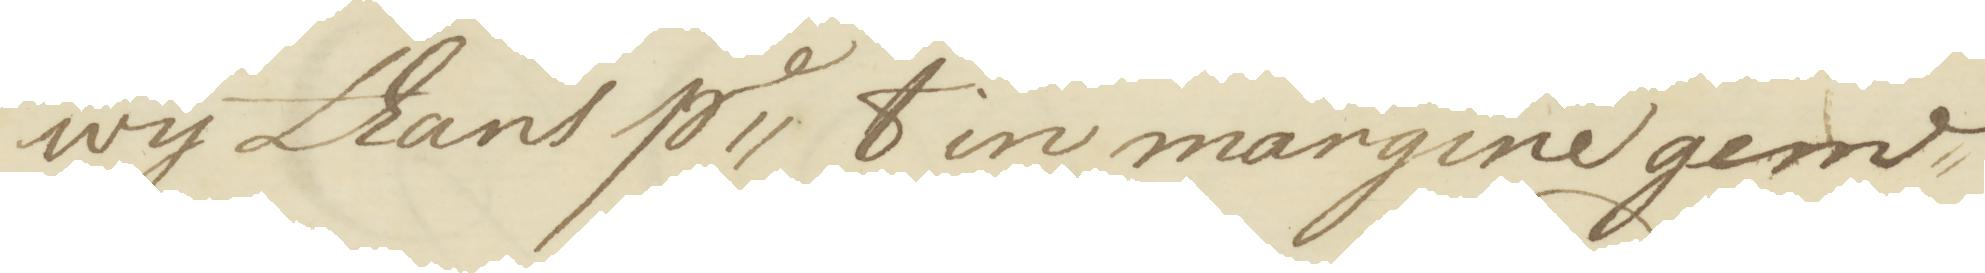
wy thans p„e t in mangine gem„e
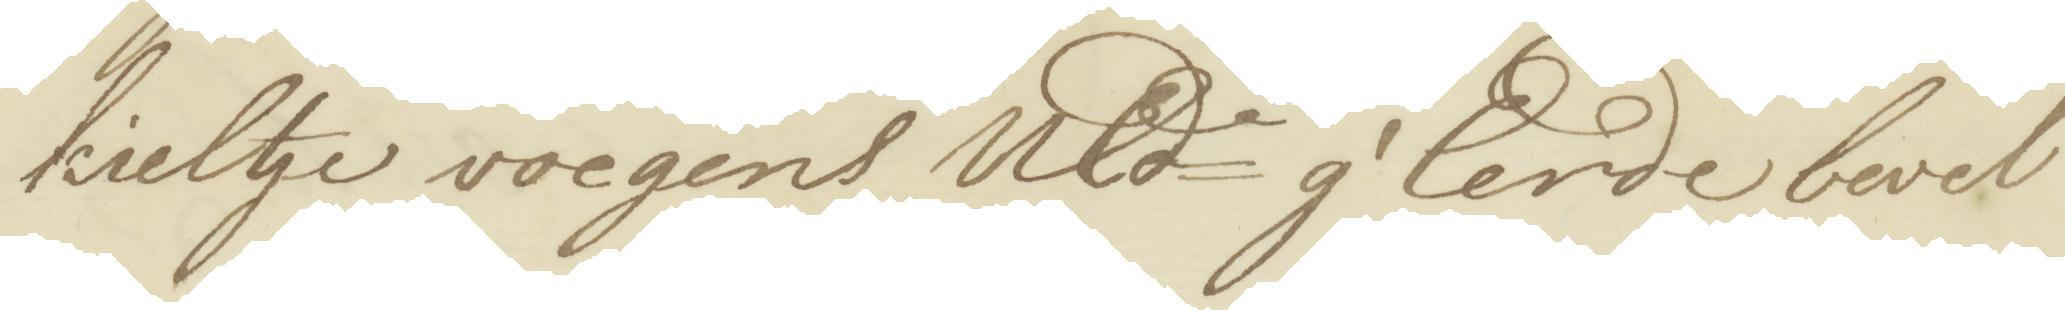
kieltje voegens UEd=e g’Eerde bevel
